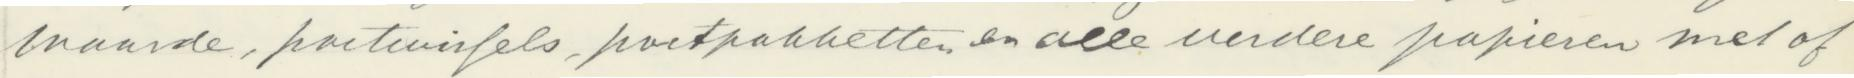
waarde, portwissels, postpakketten en alle verdere papieren met of
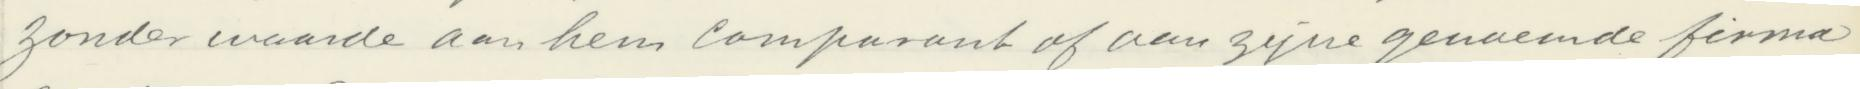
zonder waarde aan hem comparant of aan zijne genoemde firma
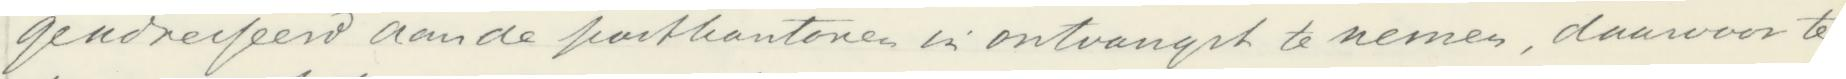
geadresseerd aan de postkantoren in ontvangst te nemen, daarvoor te
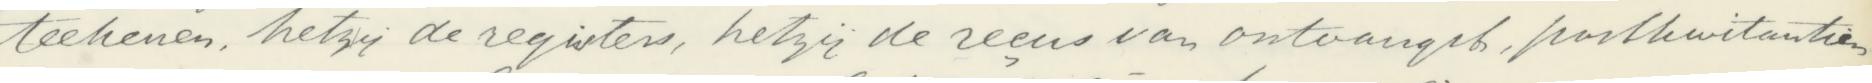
teekenen, hetzij de registers, hetzij de reçus van ontvangst, postkwitantien
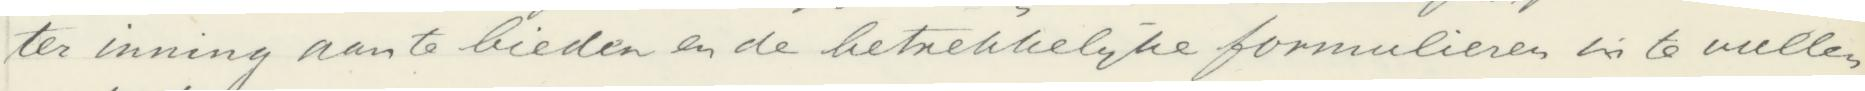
ter inning aan te bieden en de betrekkelijke formulieren in te vullen
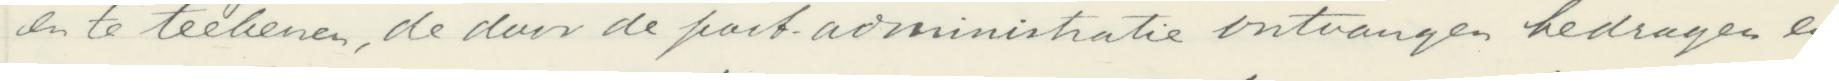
en te teekenen, de door de post-administratie ontvangen bedragen en
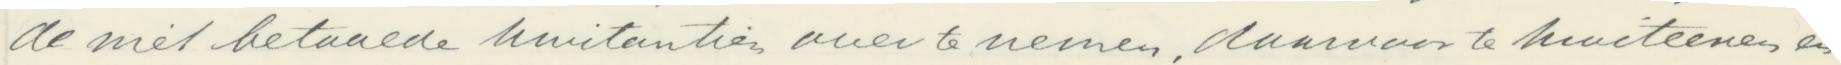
de niet betaalde kwitantien over te nemen, daarvoor te kwiteeren en
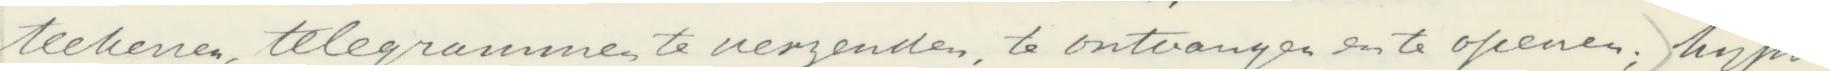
teekenen, telegrammen te verzenden, te ontvangen en te openen, hijpo
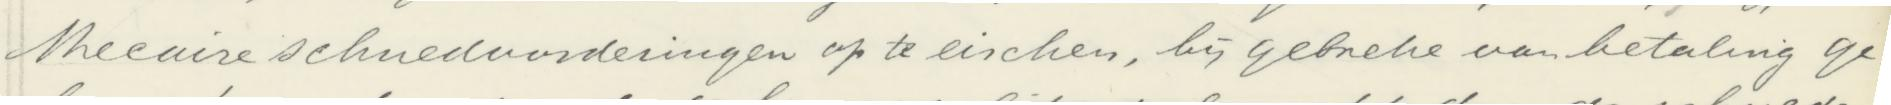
thecaire schuldvorderingen op te eischen, bij gebreke van betaling ge
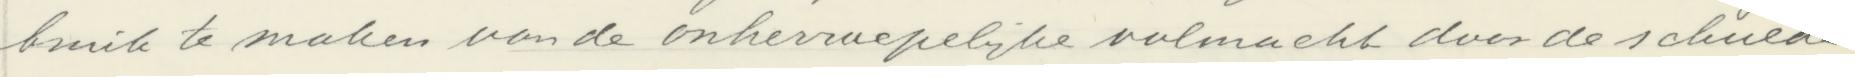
bruik te maken van de onherroepelijke volmacht door de schulde
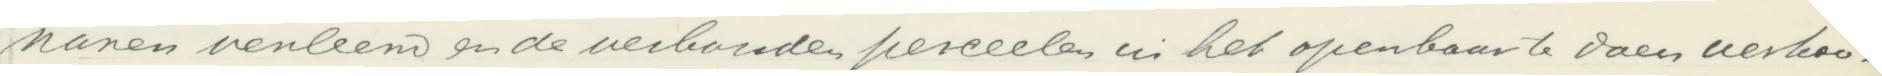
naren verleend en de verbonden perceelen in het openbaar te doen verkoo-
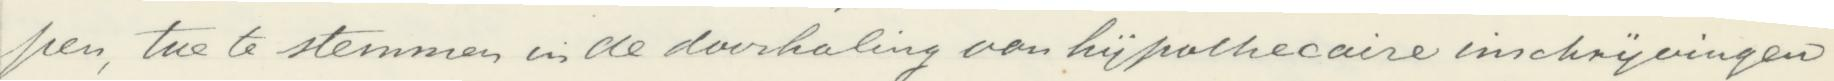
pen, toe te stemmen in de doorhaling van hijpothecaire inschrijvingen
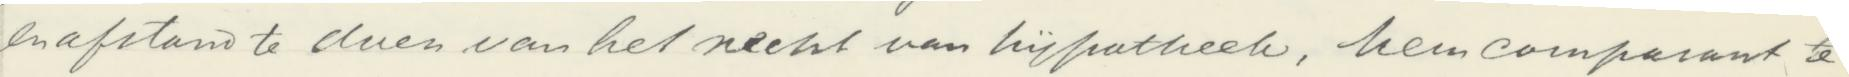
en afstand te doen van het recht van hijpotheek, hem comparant te
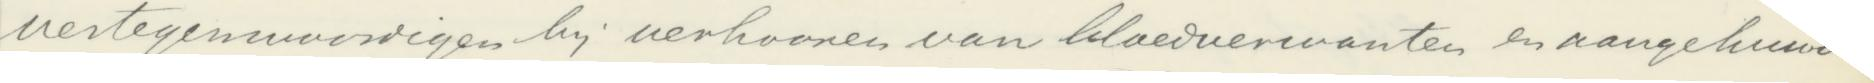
vertegenwoordigen bij verhooren van bloedverwanten en aangehuwden
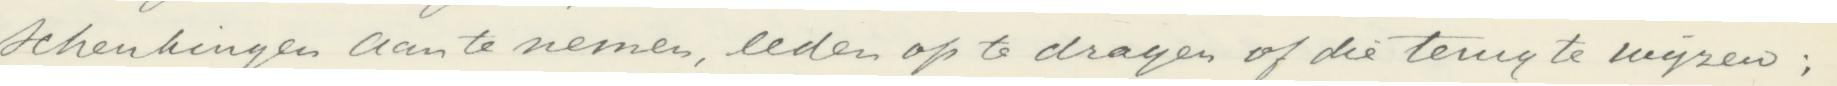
schenkingen aan te nemen, eeden op te dragen of die terug te wijzen;
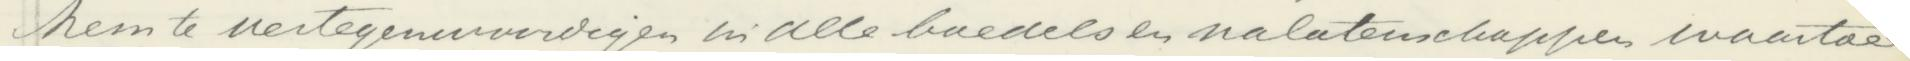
hem te vertegenwoordigen in alle boedels en nalatenschappen waartoe
